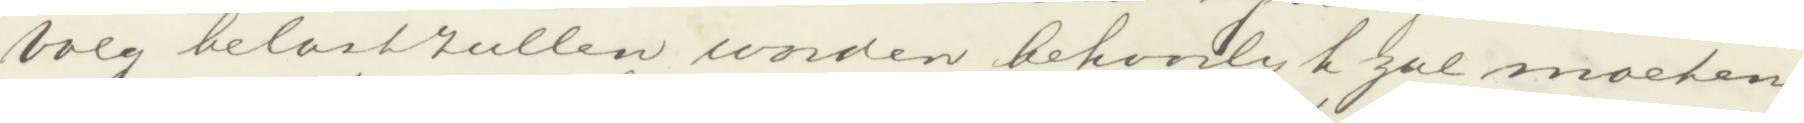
volg belast zullen worden behoorlyk zal moeten
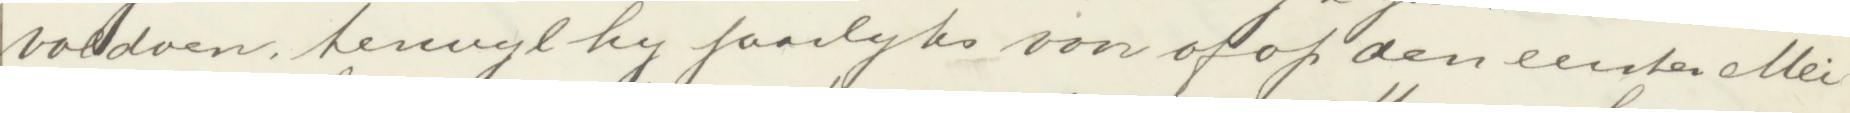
voldoen, tewjl hy jaarlyks voor of op den eersten Mei
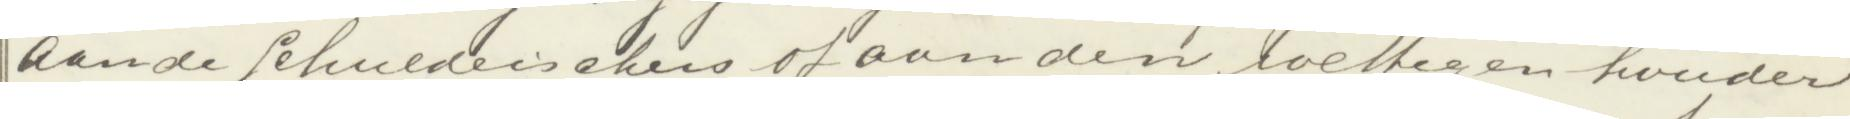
aan de schuldeischers of aan den wettigen houder
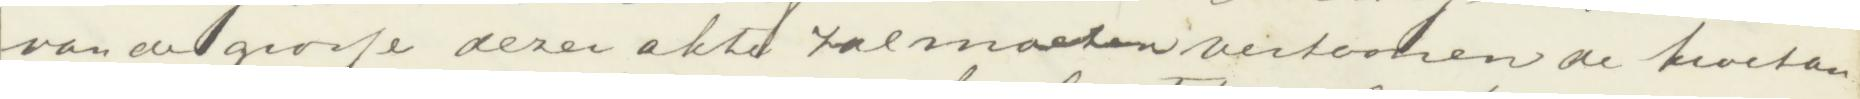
van de grosse dezer akte zal moeten vertoonen de kwitan
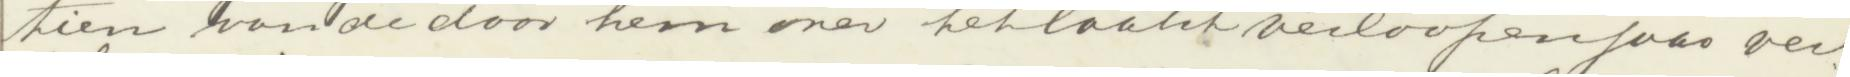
tien van de door hem over het laatst verloopen jaar ver„
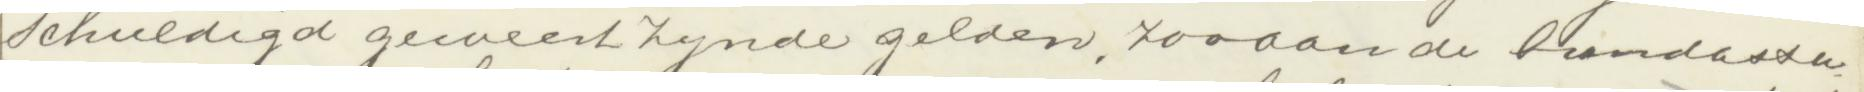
schuldigd geweest zynde gelden, zoo aan de brandassu,
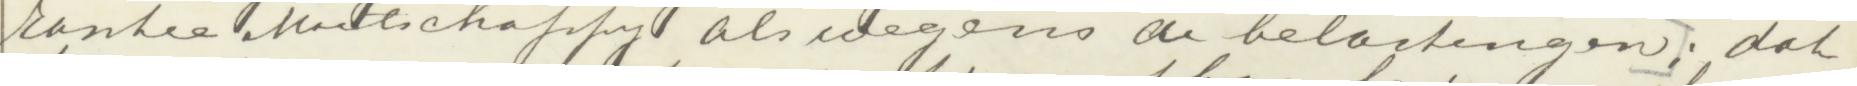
rantie Maatschappy als wegens de belastingen]; dat
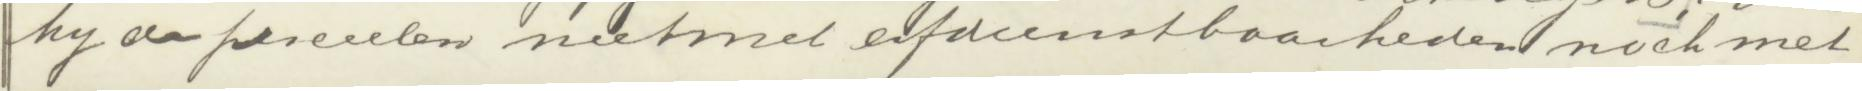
hy de perceelen niet met erfdienstbaarheden noch met
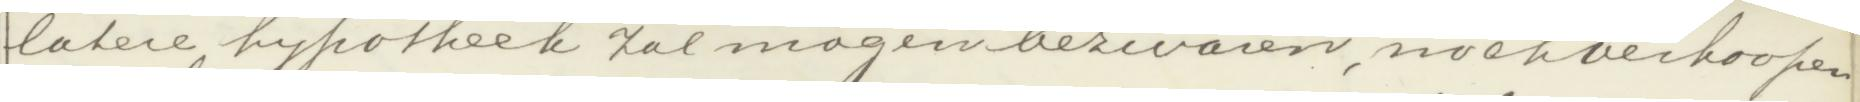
latere hypotheek zal mogen bezwaren, noch verkoopen
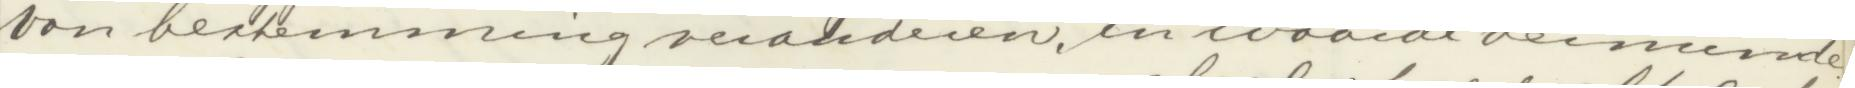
van bestemming veranderen, en waarde verminde
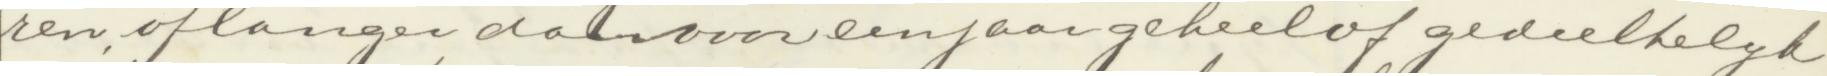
ren, of langer dan voor een jaar geheel of gedeeltelyk
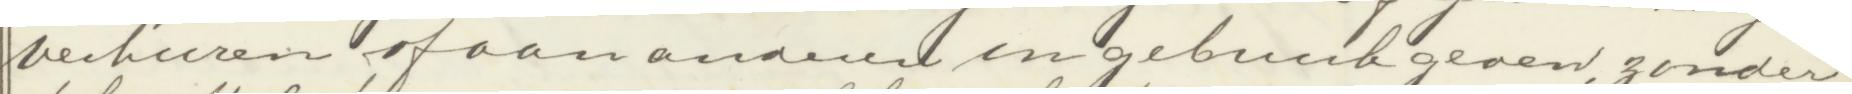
verhuren of aan anderen in gebuik geven, zonder
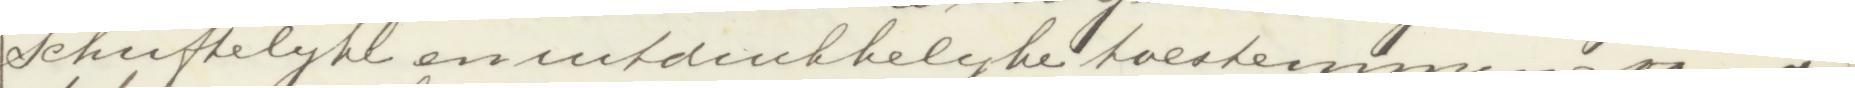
schriftelyke en uitdrukkelyke toestemming van de
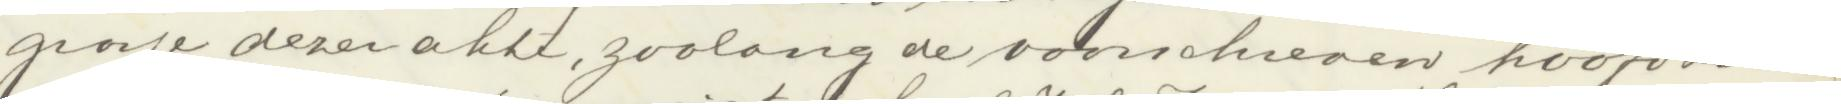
grosse dezer akte, zoolang de voorschreven hoofdsom
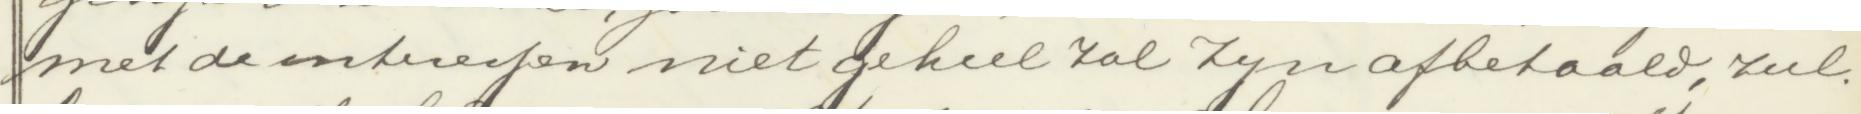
met de interessen niet geheel zal zyn afbetaald, zul,
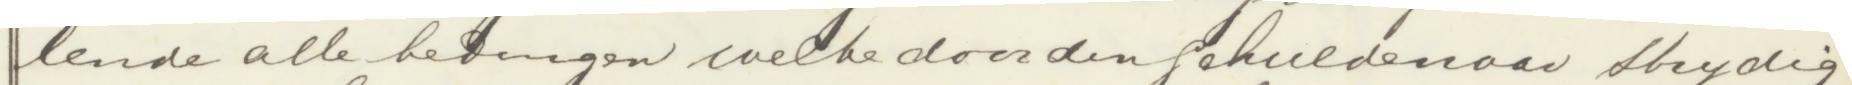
lende alle bedingen welke door den schuldenaar strydig
